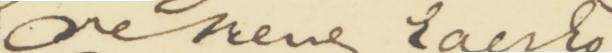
rekenen haer ho
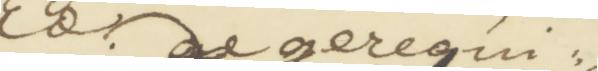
Ed: de gerequi„
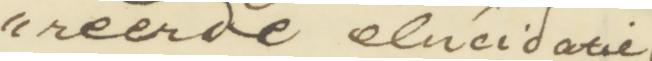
„reerde elucidatie
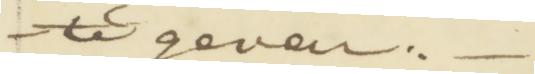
te geven.
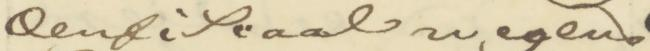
den fiscaal wegend
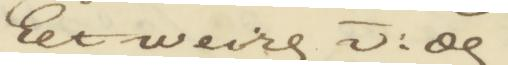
het weiren v: de
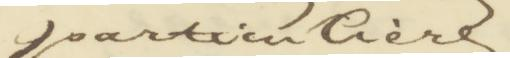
particulieren
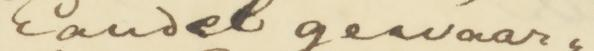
handel gewaar„
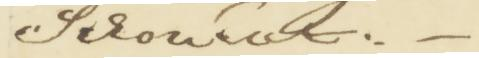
schouwt:-
